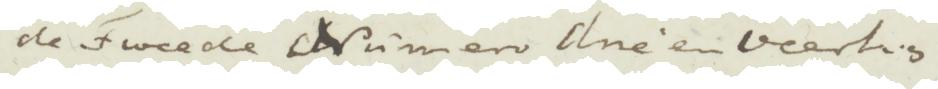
de Tweede Numero drie en veertig
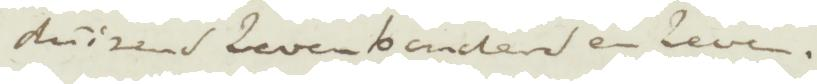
duizend zeven honderd en zeven.
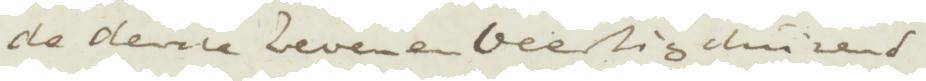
de derde zeven en veertig duizend
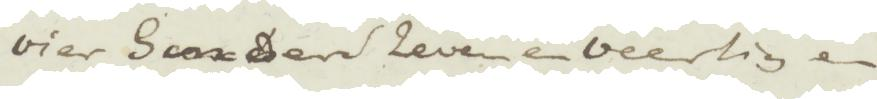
vier honderd zeven en veertig en
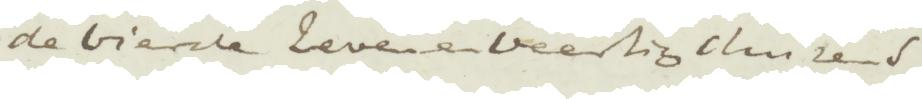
de vierde zevenen veertig duizend
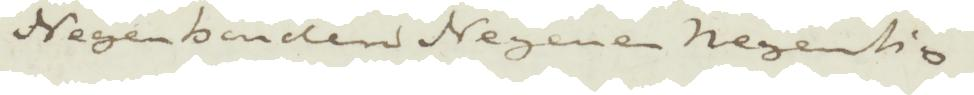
Negen honderd Negenen negentig.
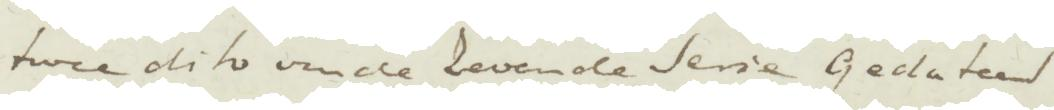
twee dito van de zevende serie Gedateerd
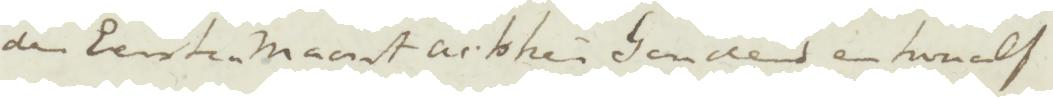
de Eerste maart achtien Honderd en twaalf
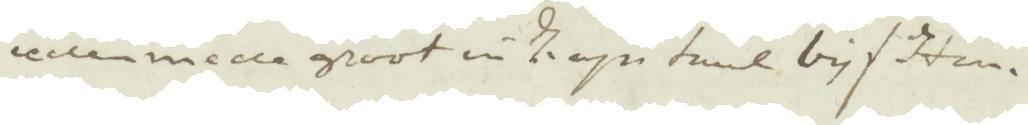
ieder mede groot in kapitaal vijf Hon„
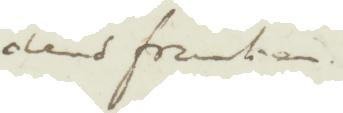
derd franken.
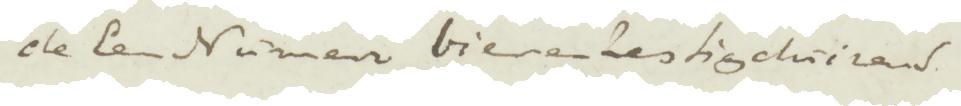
de Een Numero vier en Zestigduizend
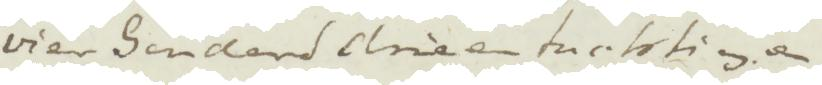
vier honderd drie en tachtig, en
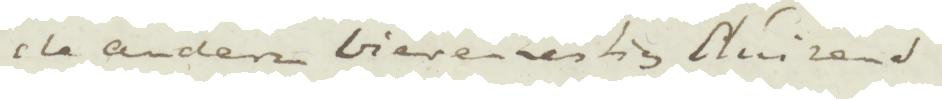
de andere vieren zestig duizend
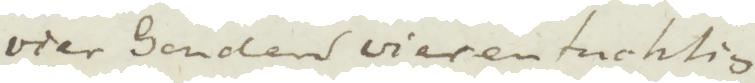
vier honderd vier en tachtig.
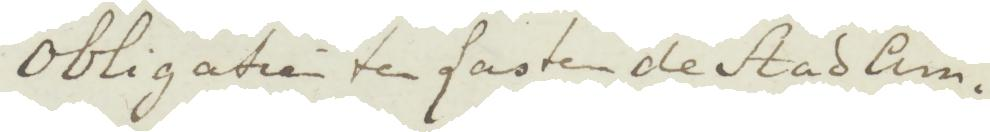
Obligatien ten Lasten de Stad Am„
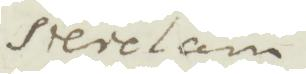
sterdam
